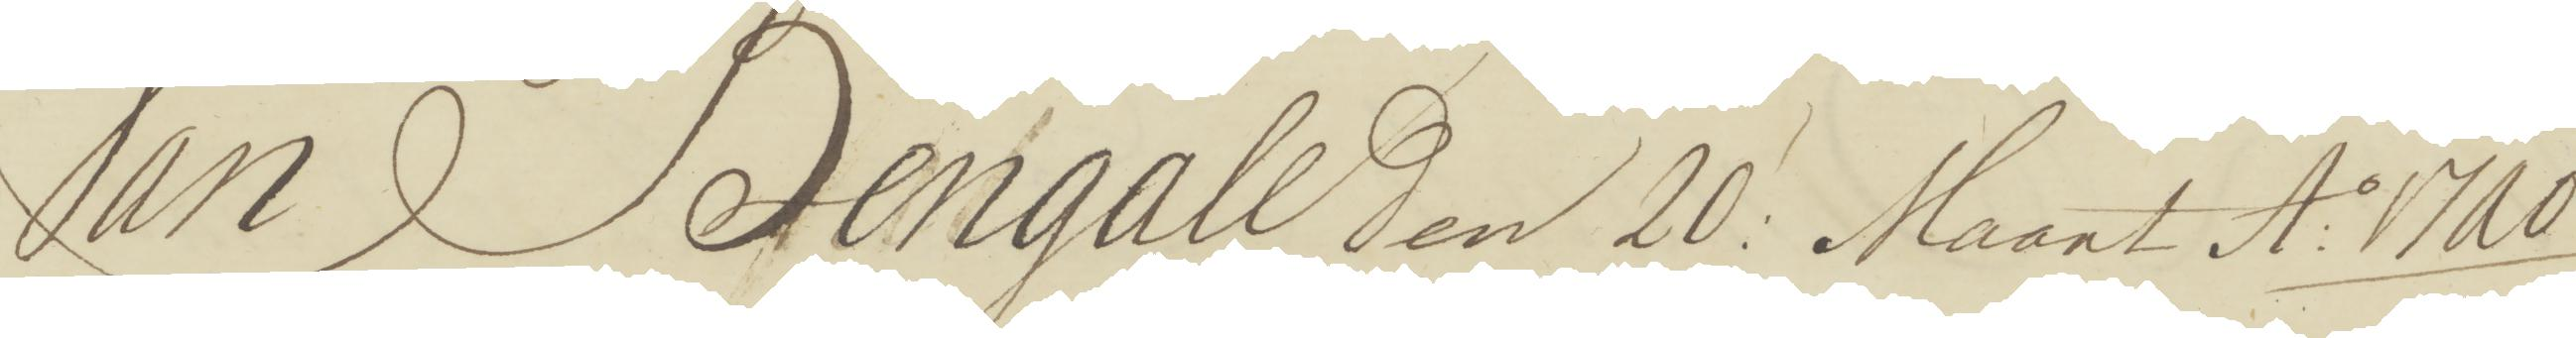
Van Bengale den 20:' Maart A:o 1740
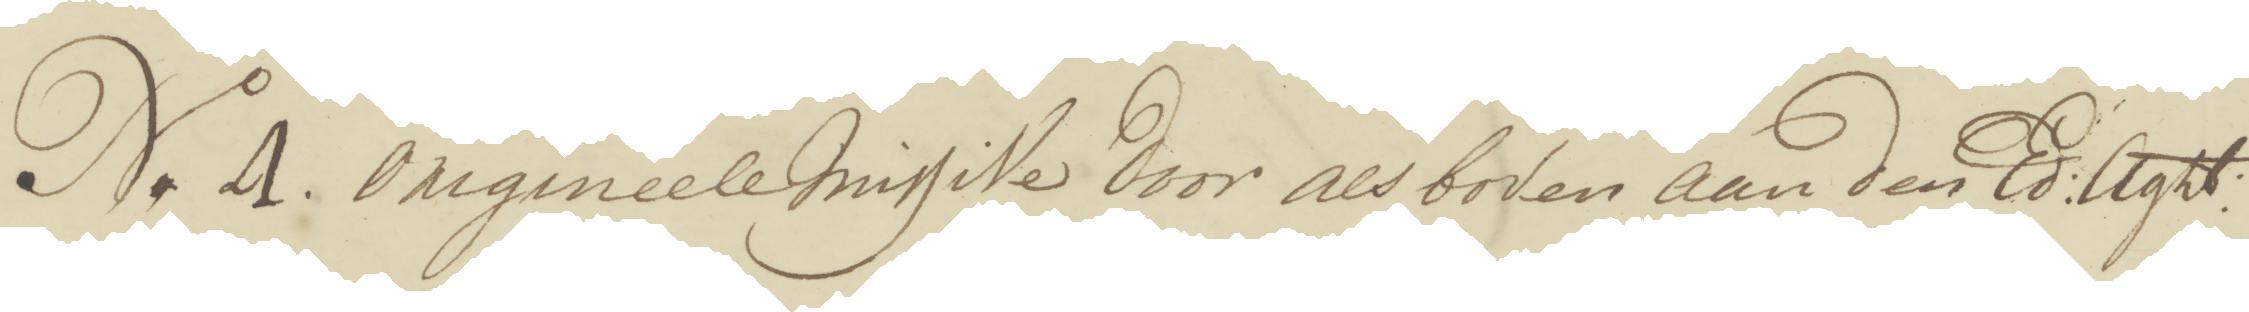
N„o 4. Origineele missive door als boven aan den Ed: Agtb:
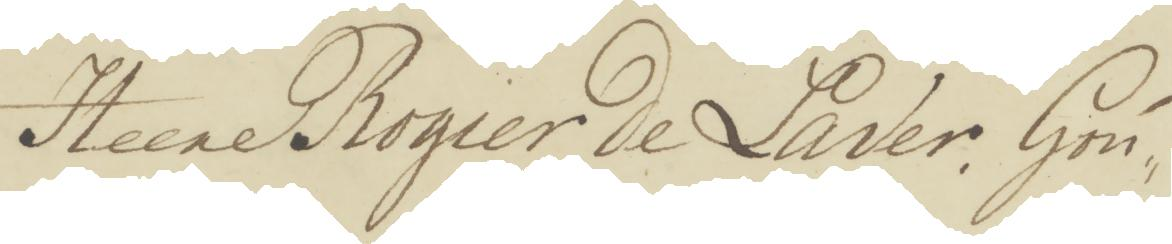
Heere Rogier de Laver Gou„
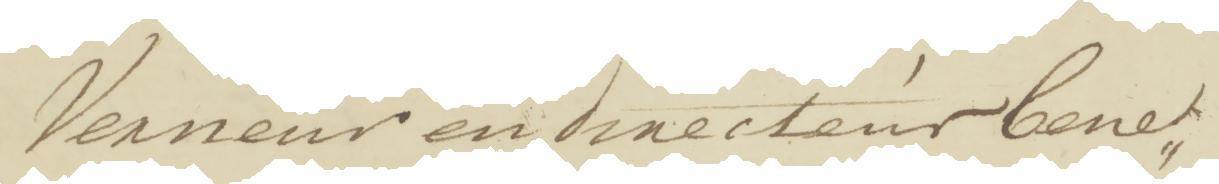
verneur en directeur bene„
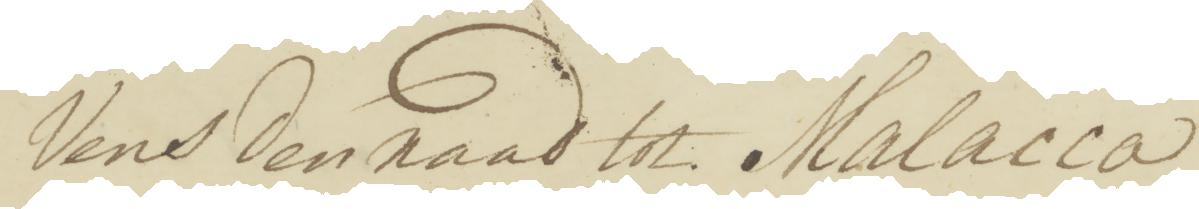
vens den raad tot Malacca
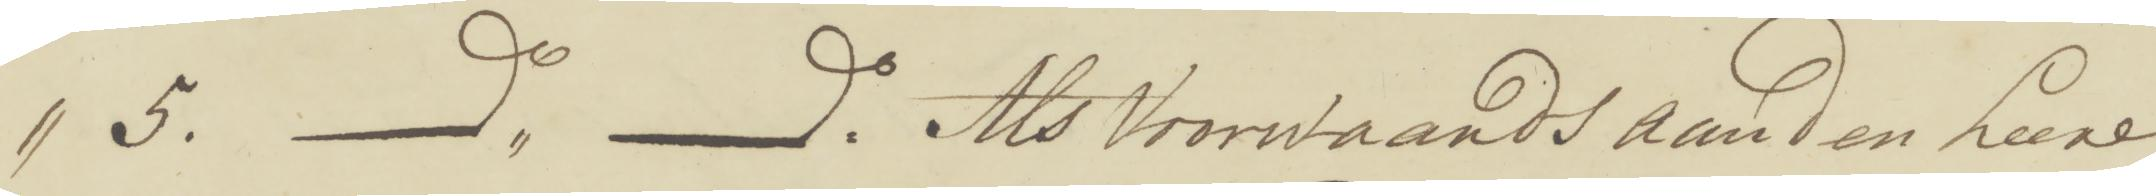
„ 5. _„o _„o Als voorwaards aan den heere
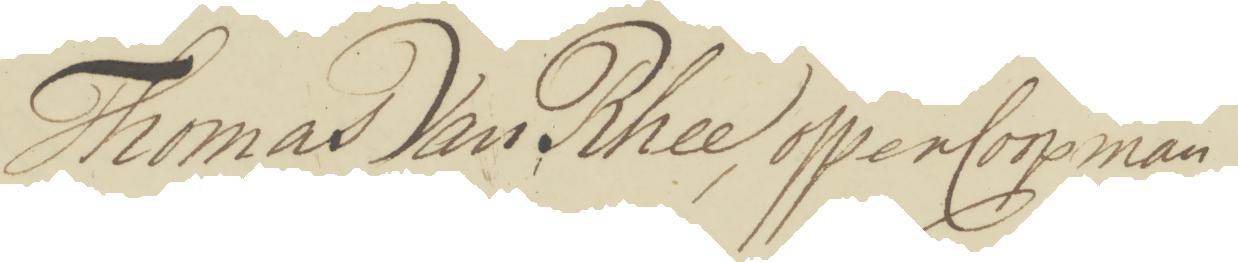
Thomas Van Rhee, opperCoopman
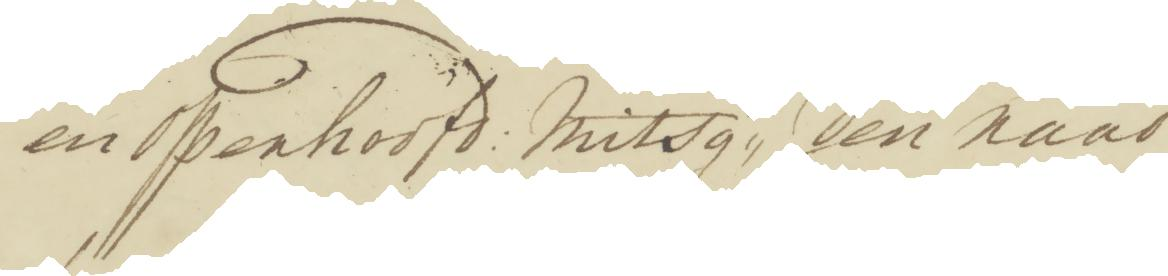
en opperhoofd: mitsg„s den raad
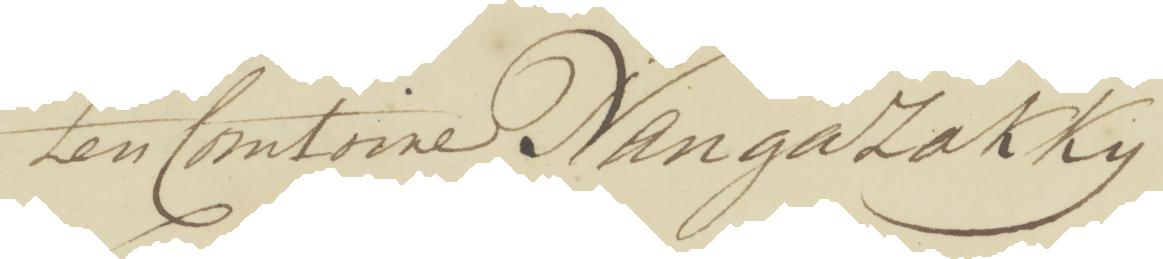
ten Comtoire Nangazakkij
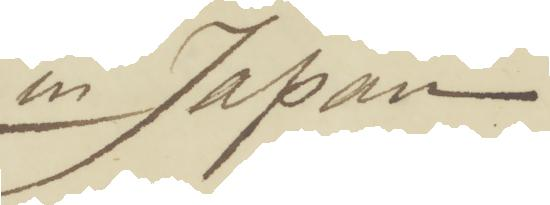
in Japan
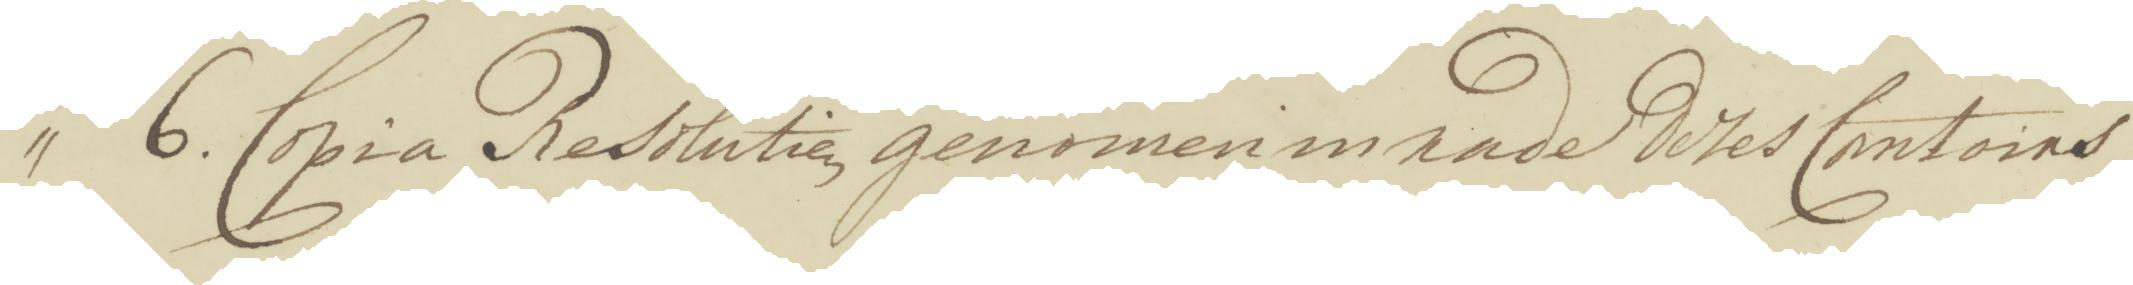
„ 6. Copia Resolutien genomen in rade dezes Comtoirs,
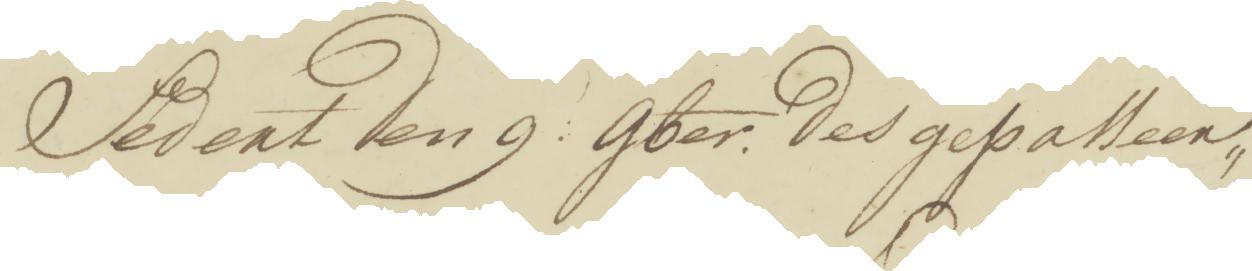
Sedert den 9: gber: des gepasseer„
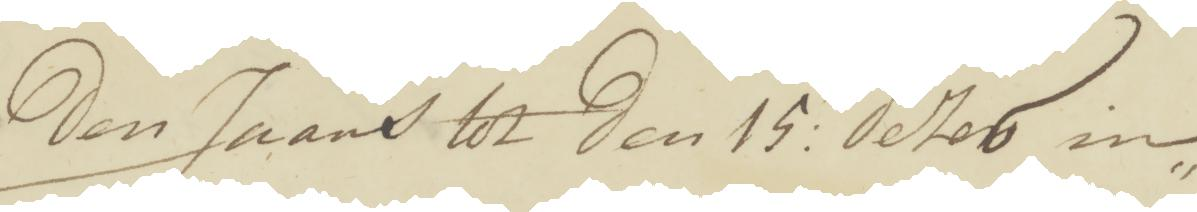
den Jaars tot den 15: dezes in
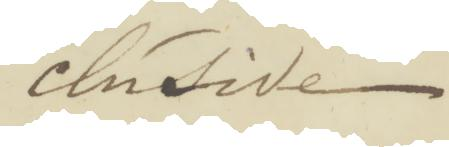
clusive
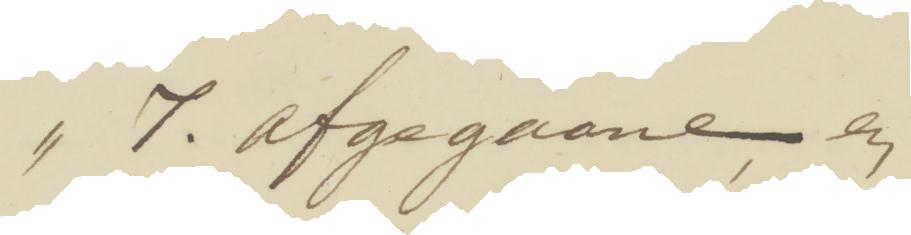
„ 7. afgegaane, en
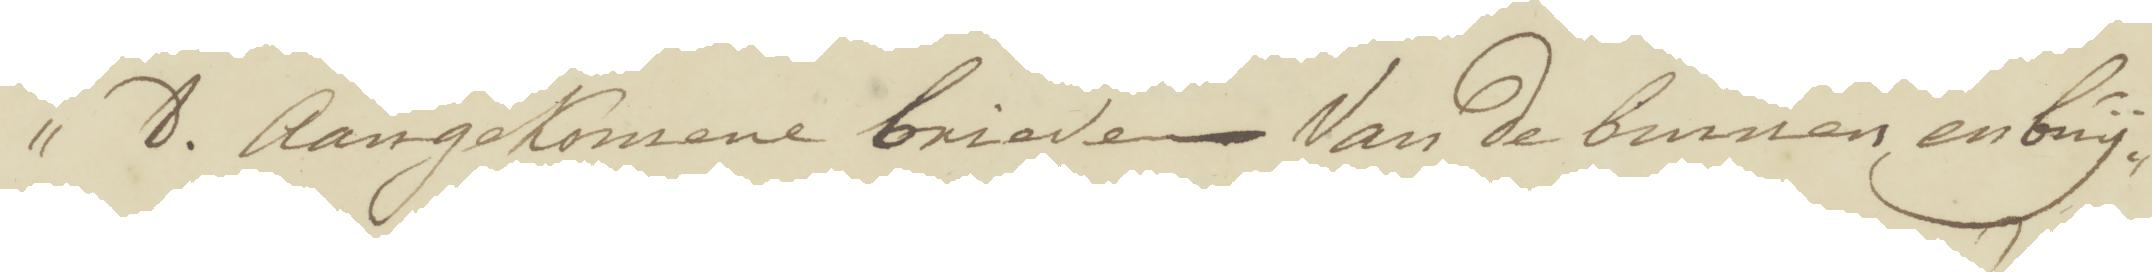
„ 8. Aangekomene brieven van de binnen en buij„
